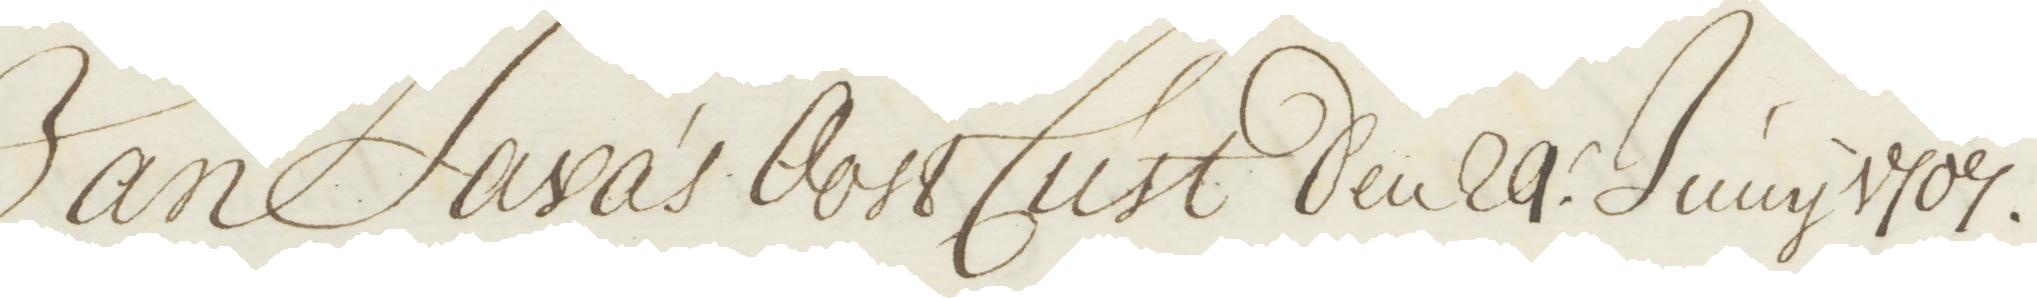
Van Java's Oost Cust den 24.' Junij 1707.
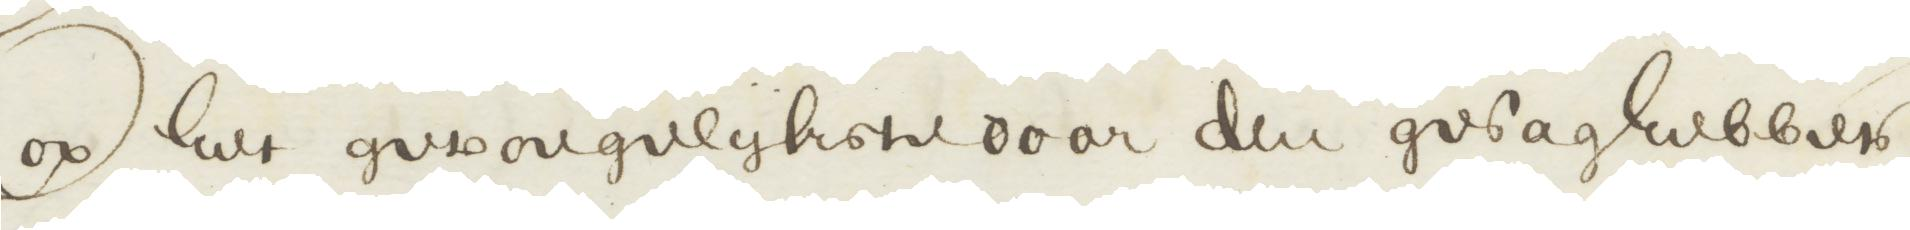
op het gevoegelijkste door den gesaghebbers
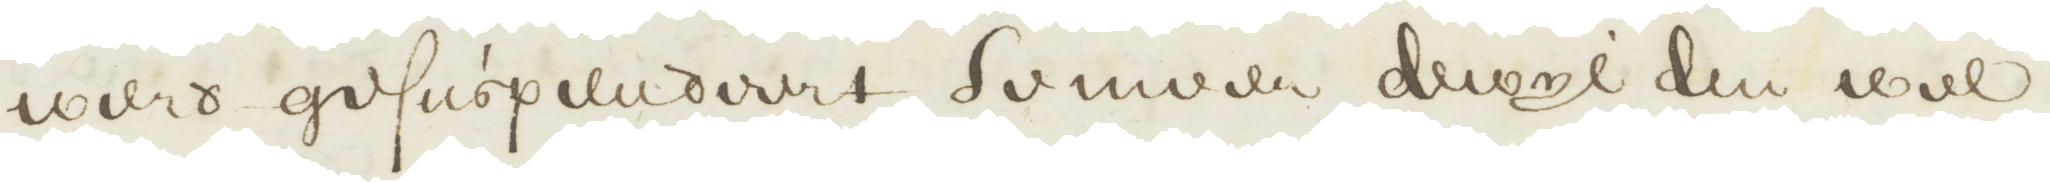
werd gesuspendeert te meer dewijl den wel
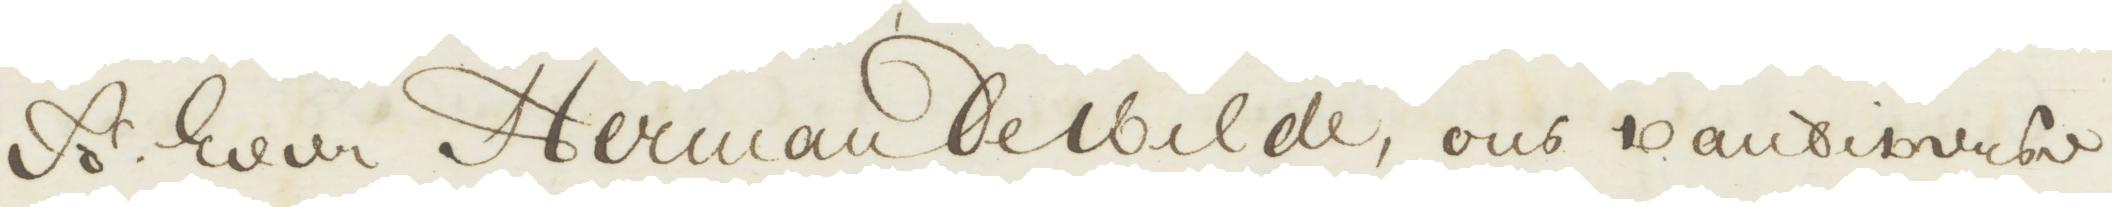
Ed.' heer Herman de wilde, ons van diverse
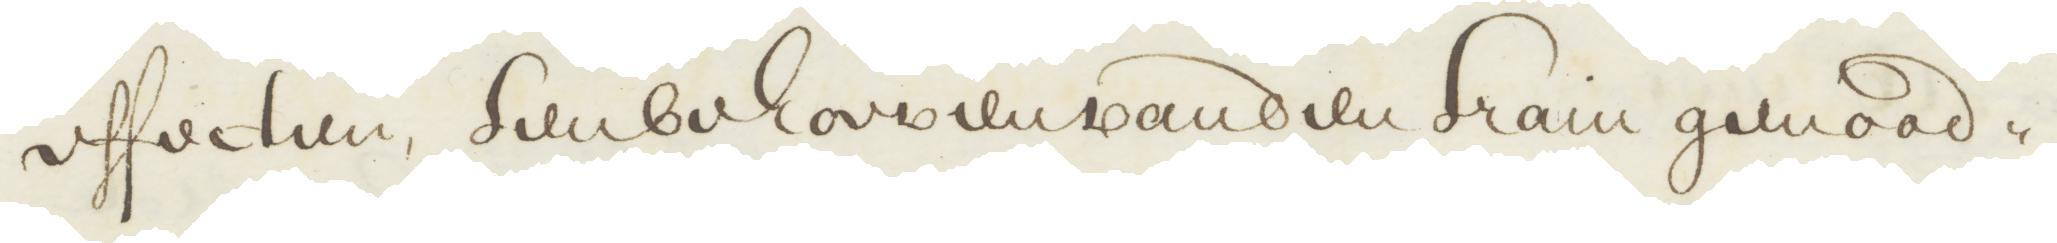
effecten, ten behoeven van den train genood„
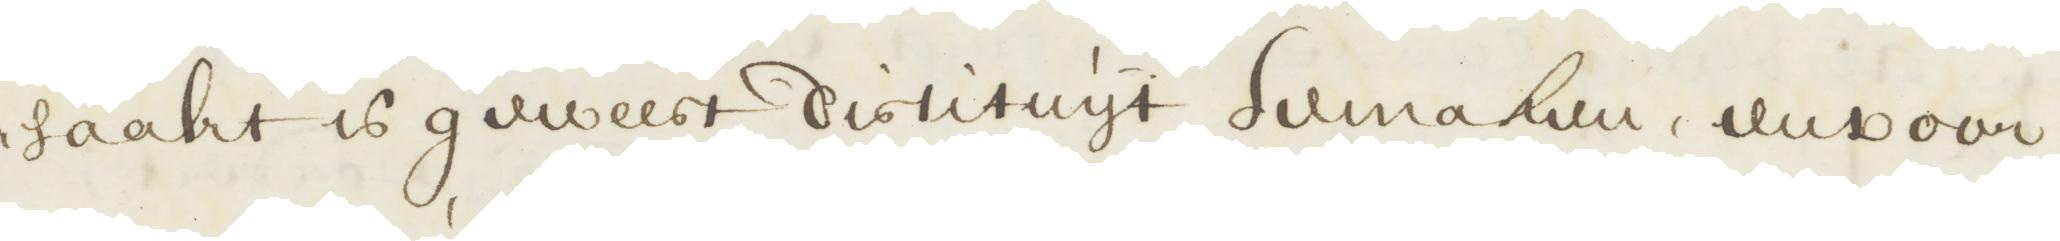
saakt is geweest distituijt te maken, en voor
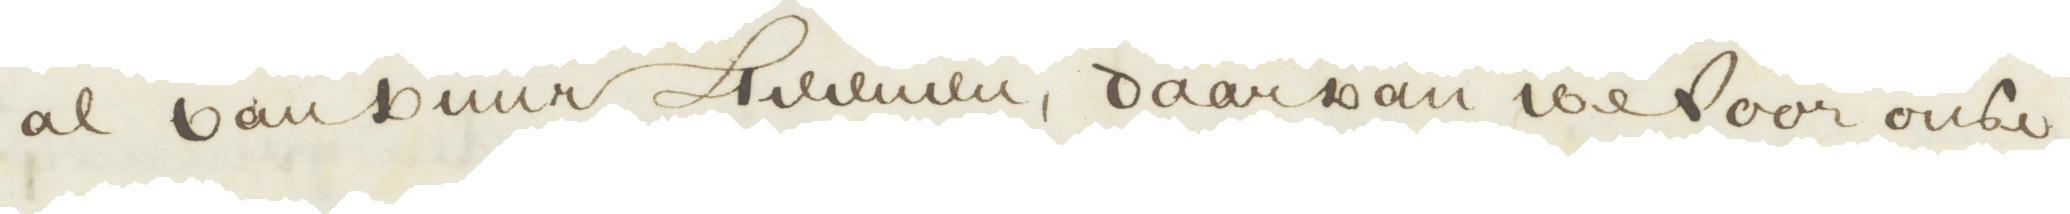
al van vuur steenen, daarvan we voor onse
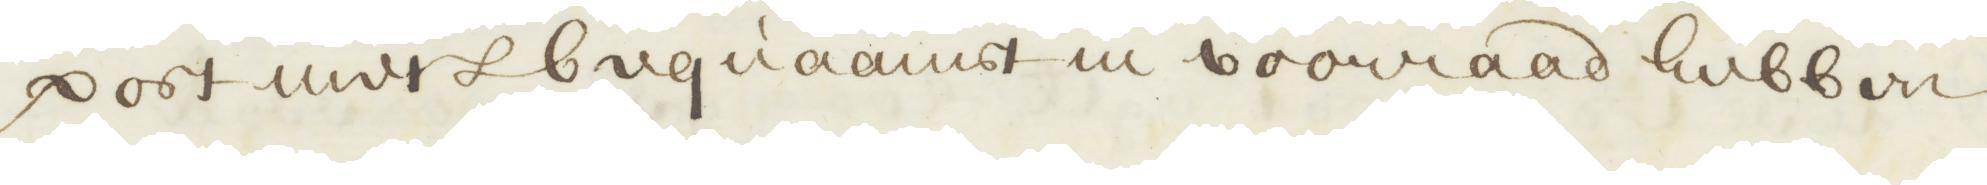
post niets bequaamst in voorraad hebben
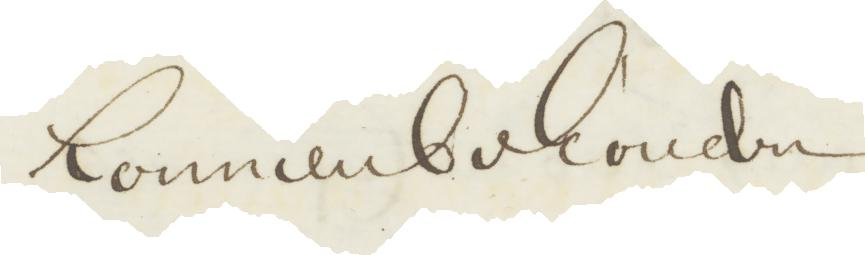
konnen behouden
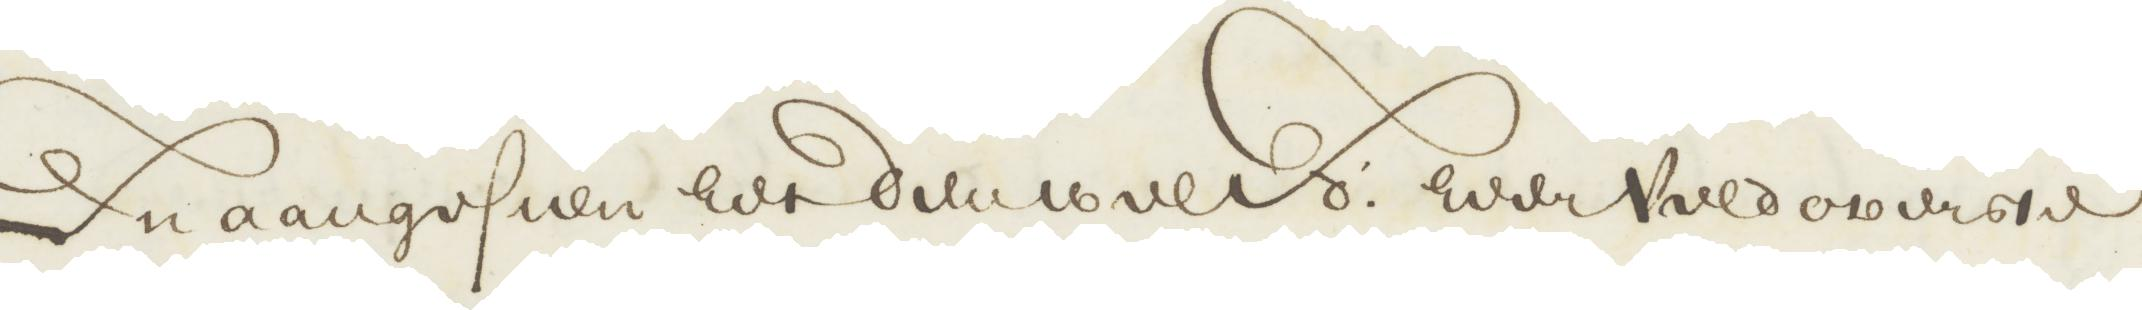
En aangesien het den wel Ed: heer veldoverste
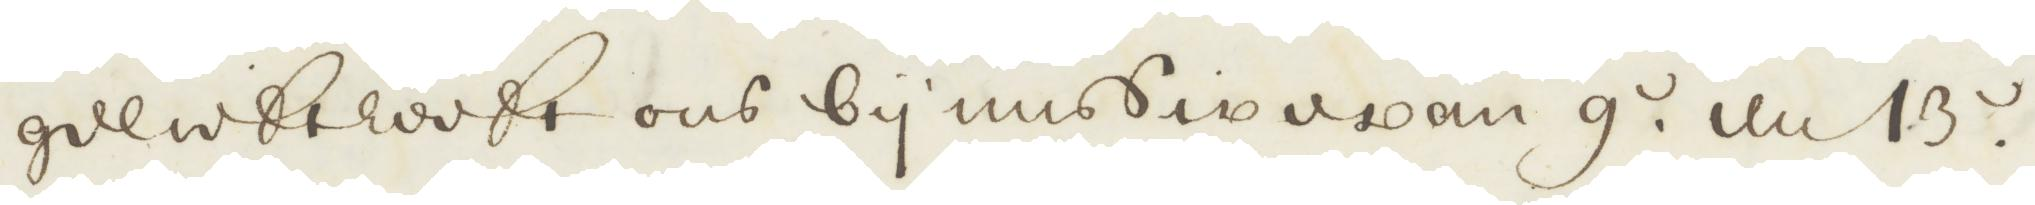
gelieft heeft ons bij missive van 9.' en 13.'
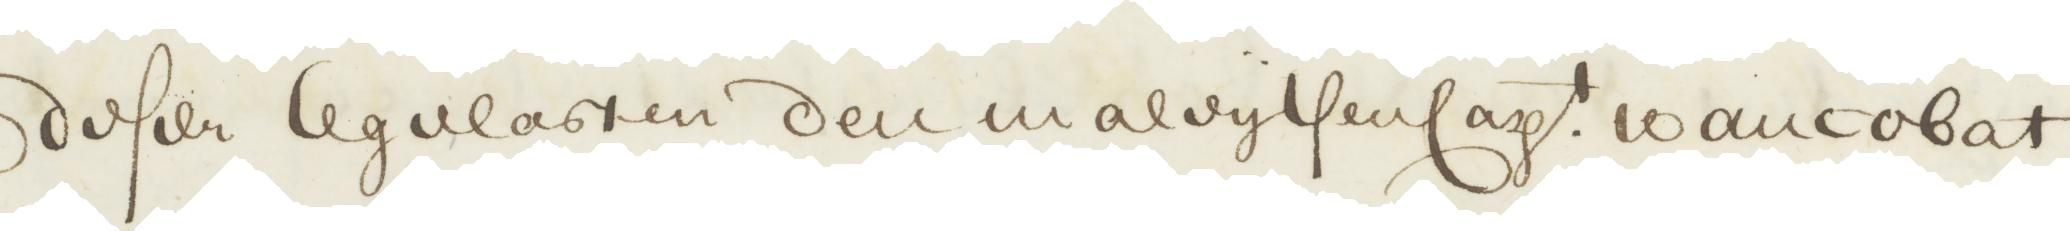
deser te gelasten den maleijtsen Cap.t wancobat
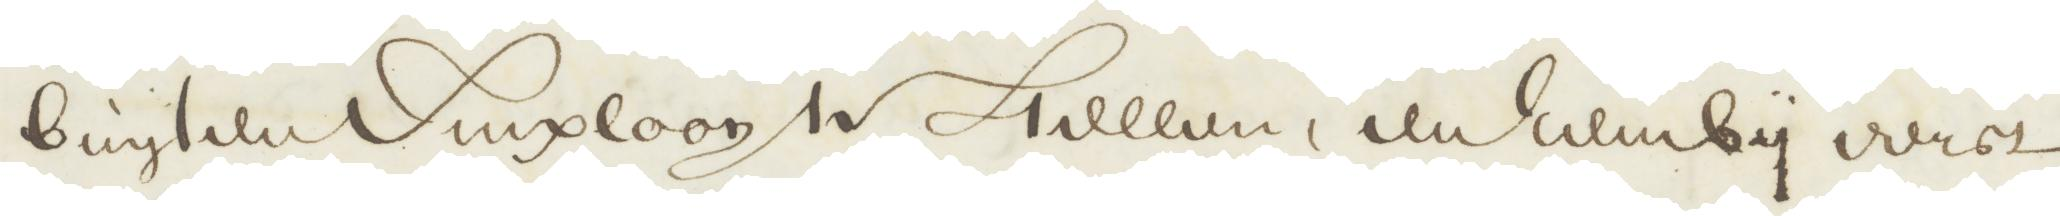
buijten Emplooij te stellen, en hem bij eerst
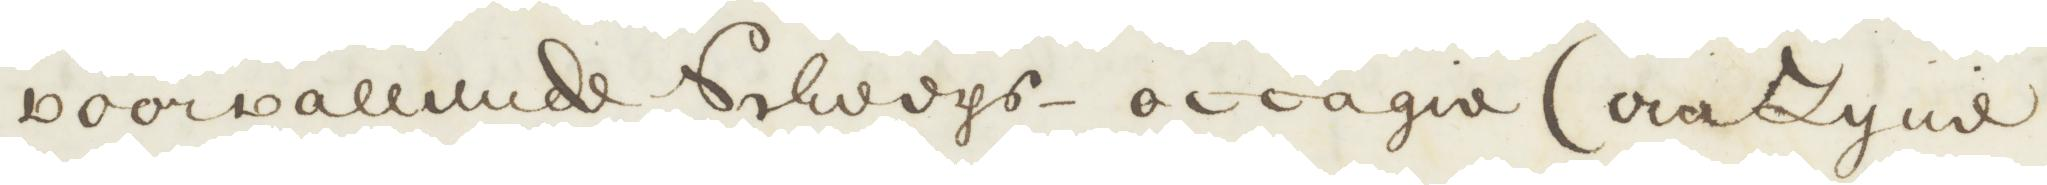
voorvallende scheeps-occagie (om zyne
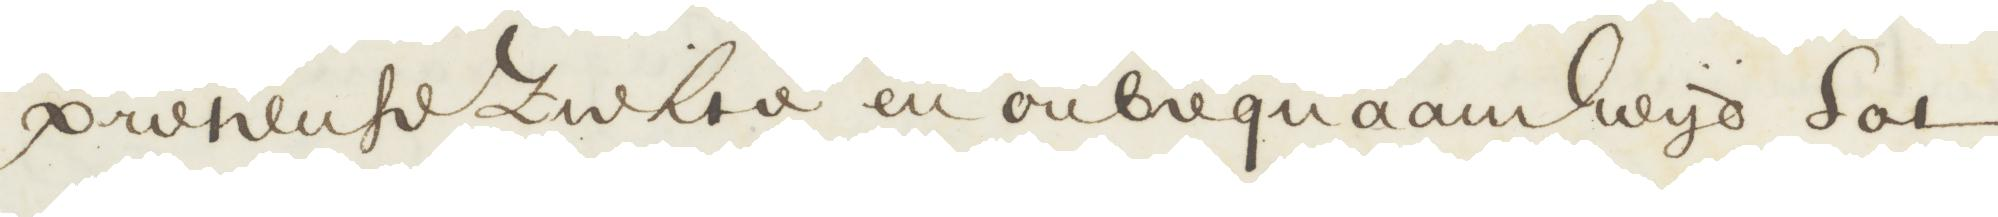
preteuse ziekte en onbequaamheijd tot
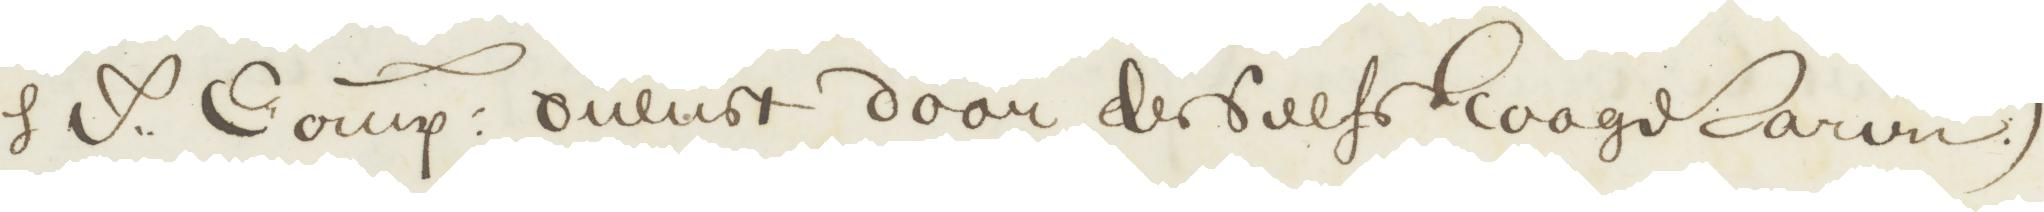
's E: Comp: dienst door desselfs hooge Jaren:)
